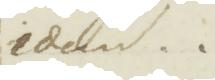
idem. .
